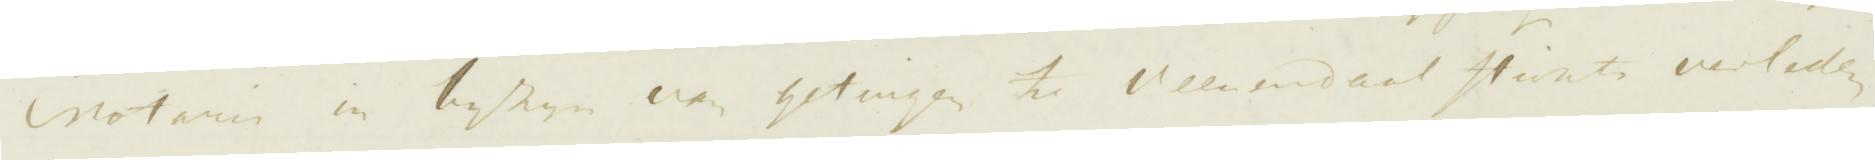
Notaris in byzyn van getuigen te veenendaal stichts verleden
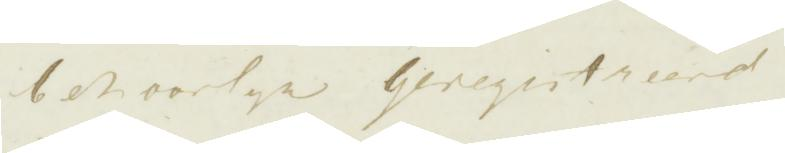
behoorlyk Geregistreerd
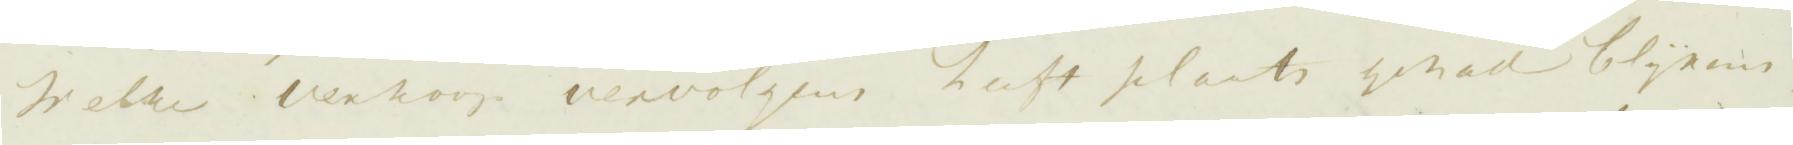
Welke verkoop vervolgens heeft plaats gehad blijkens
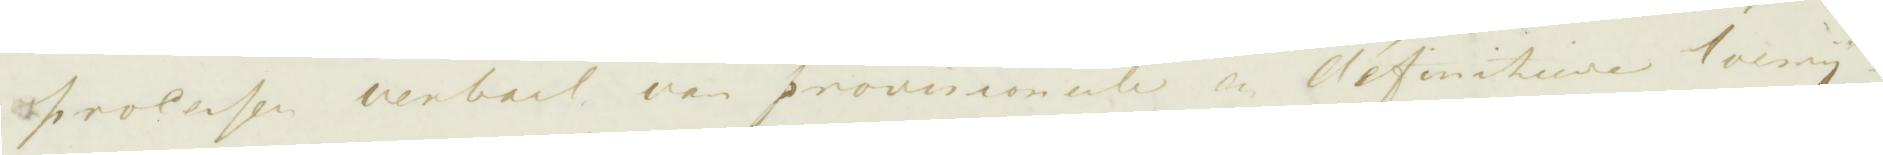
processen verbaal, van provisioneele en definitieve toewij
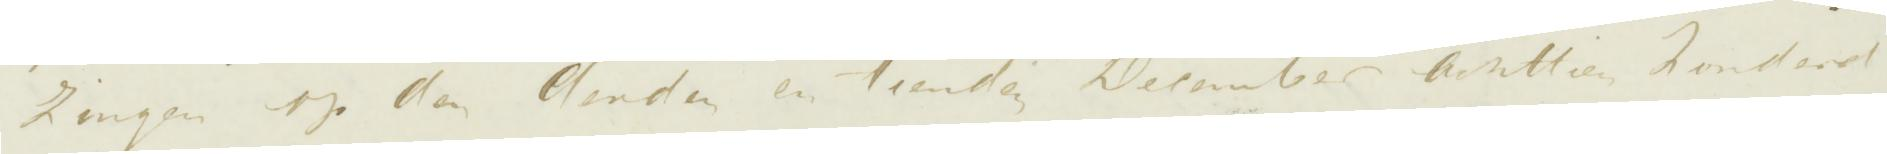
zingen op den derden en tienden December achttien honderd
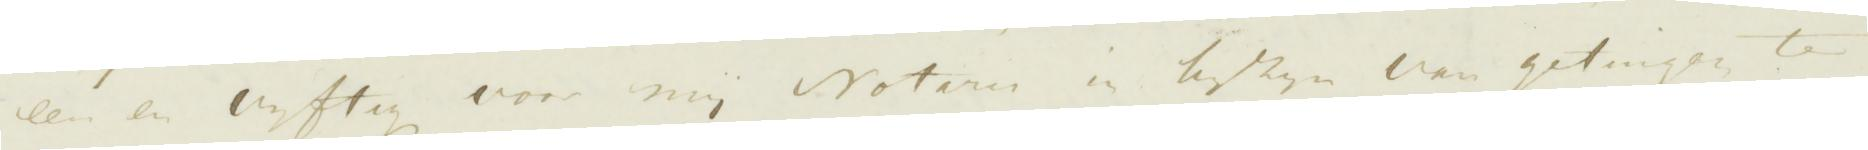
een en vyftig voor mij Notaris in byzyn van getuigen te
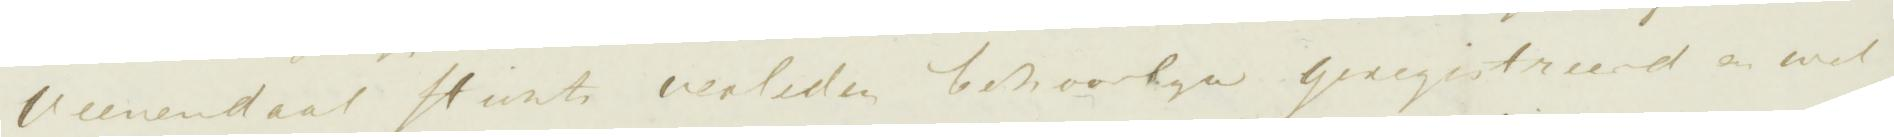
Veenendaal stichts verleden behoorlyk geregistreerd en wel
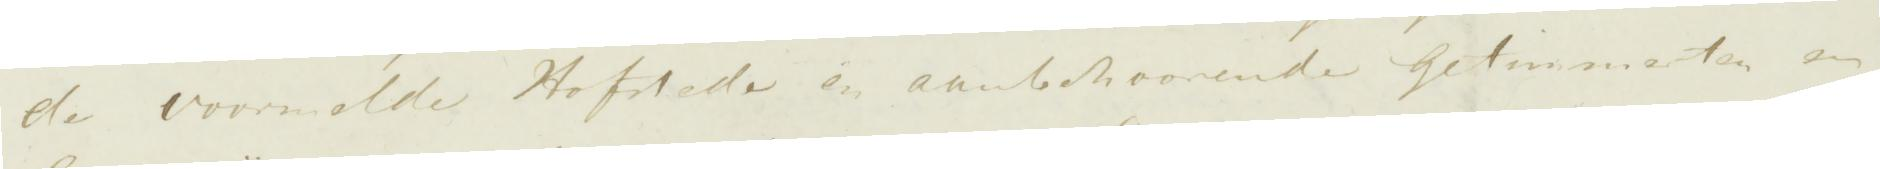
ke voormelde Hofstede en aanbehoorende getimmerten en
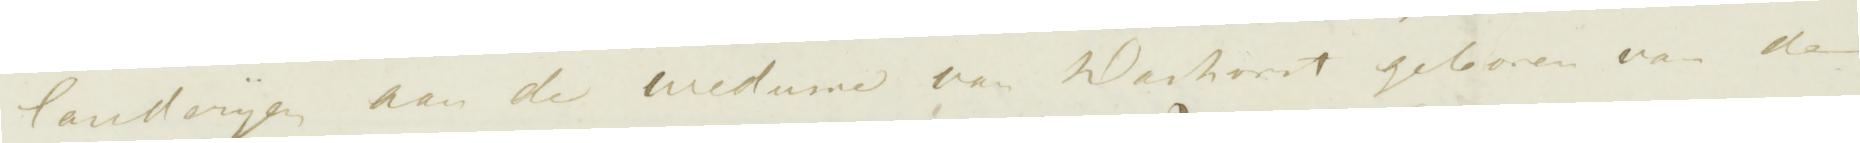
landerijen aan de weduwe van Dashorst geboren van de
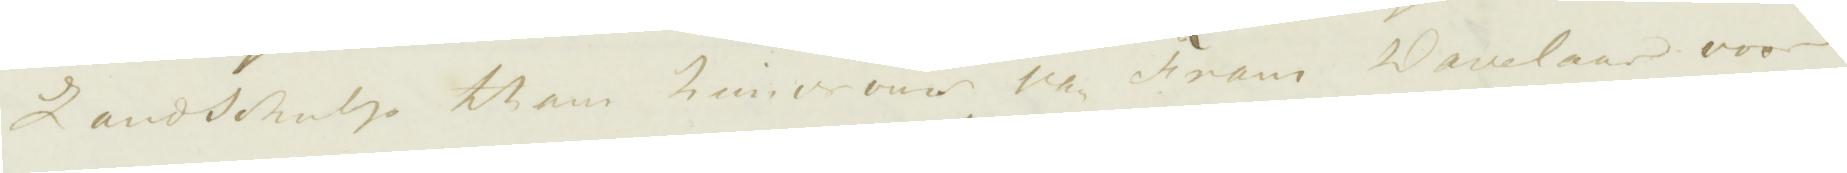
Zandschulp thans huisvrouw van Frans Davelaar voor
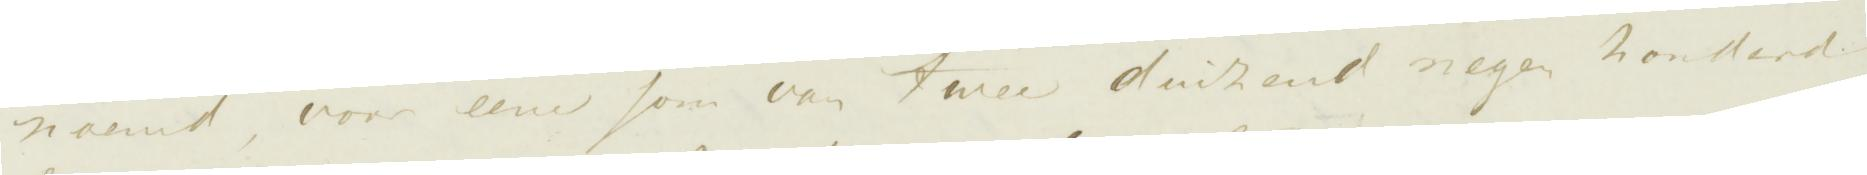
noemd, voor eene som van twee duizend negen honderd
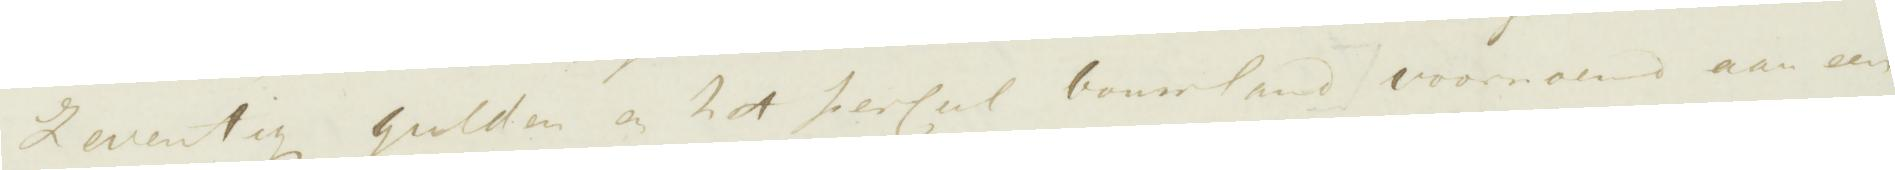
Zeventig gulden en het perceel bouwland voornoemd aan een
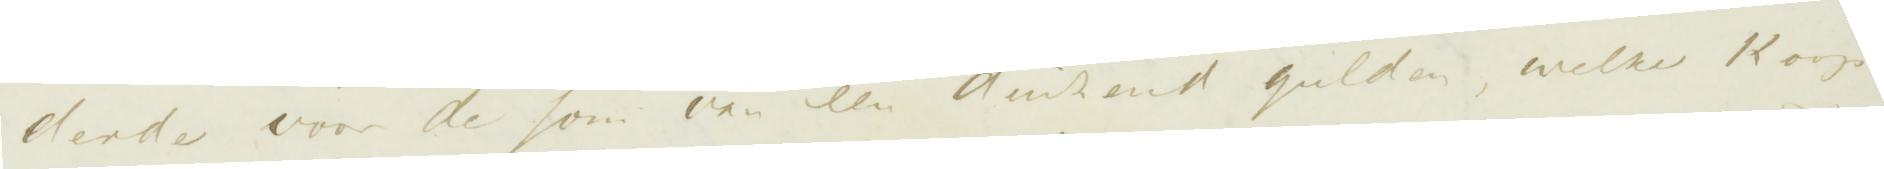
derde voor de som van een duizend gulden, welke Koop
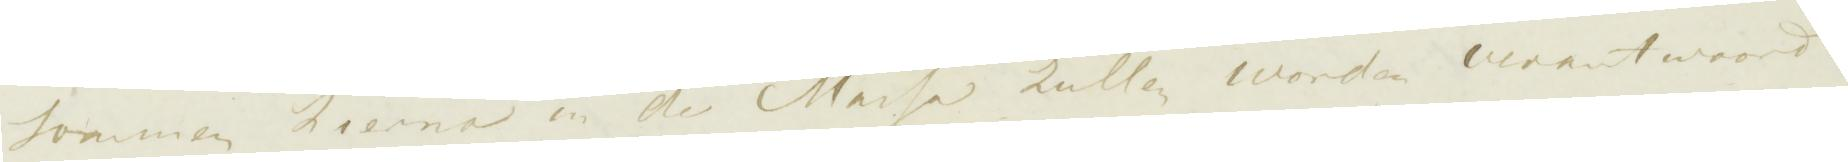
sommen hierna in de Massa zullen worden verantwoord.
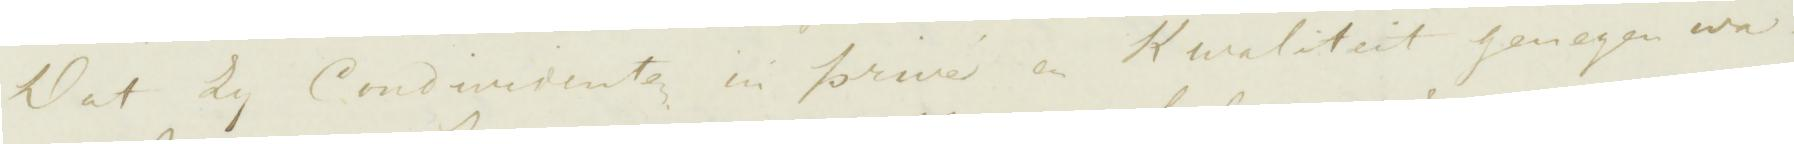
Dat zij Condividenten in privé en kwaliteit genegen wa
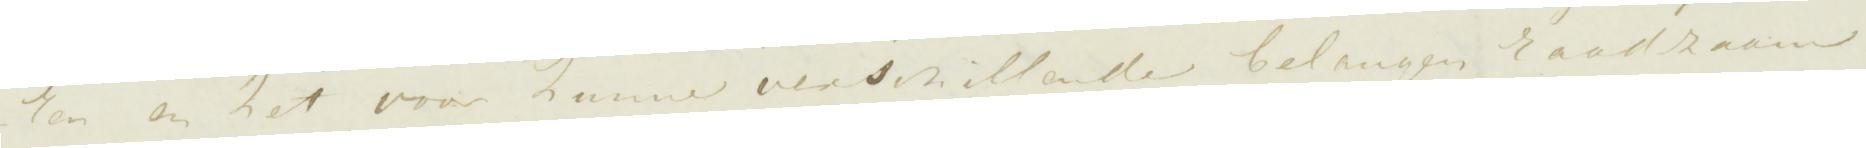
ren en het voor hunne verschillende belangen raadzaam
